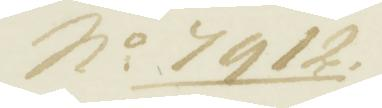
N.o 7912.
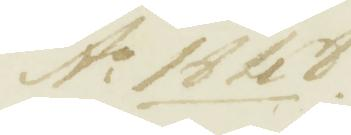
A:o 1848.
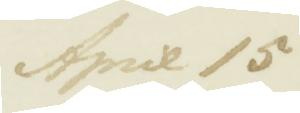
April 15
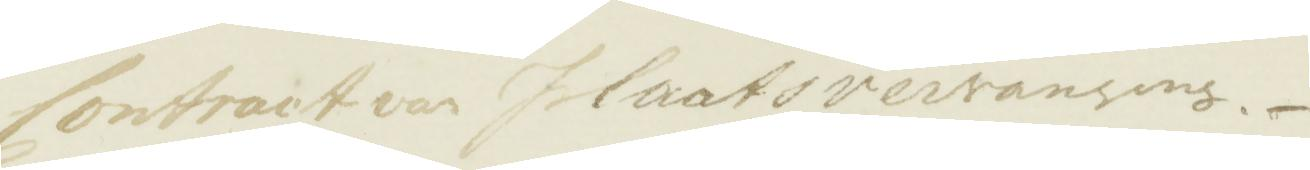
Contract van Plaatsvervanging.—
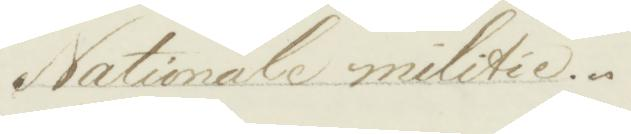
Nationale militie.—
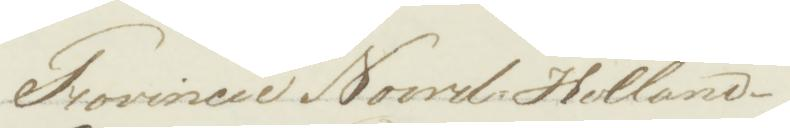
Provincie Noord: Holland-
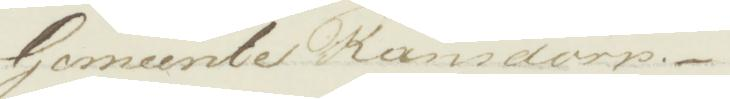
Gemeente Ransdorp.—
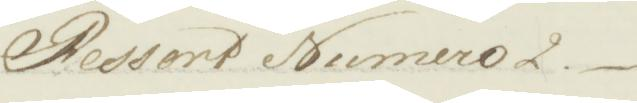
Ressort Numero 2.—
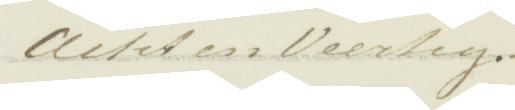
Acht en Veertig.
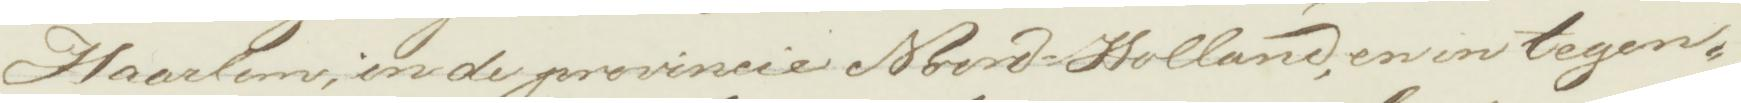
Haarlem, in de provincie Noord=Holland, en in tegen„
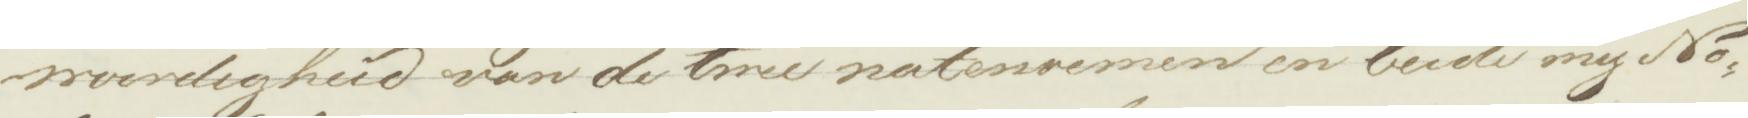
„woordigheid van de twee natenoemen en beide my No„
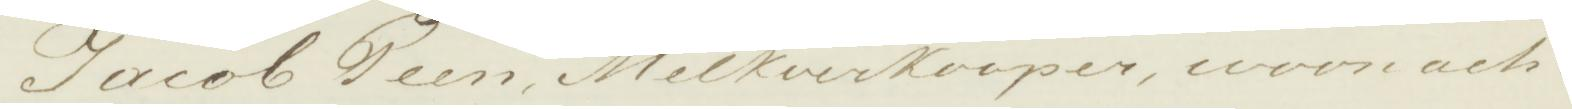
Jacob Peen, Melkverkooper, woonach.
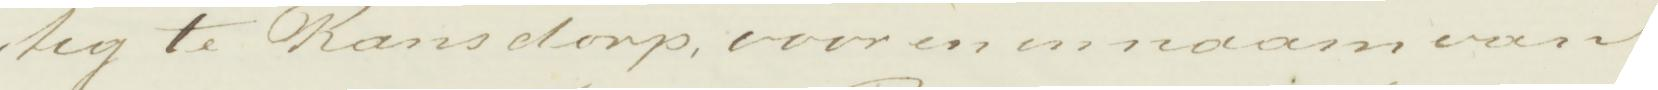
tig te Ransdorp, voor en in naam van
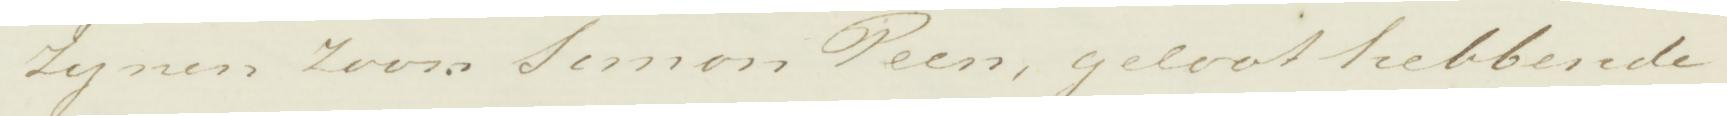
zijnen zoon Simon Peen, geloot hebbende
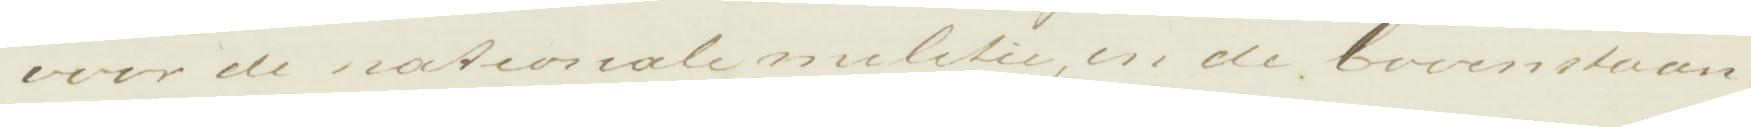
voor de nationale militie, in de bovenstaan
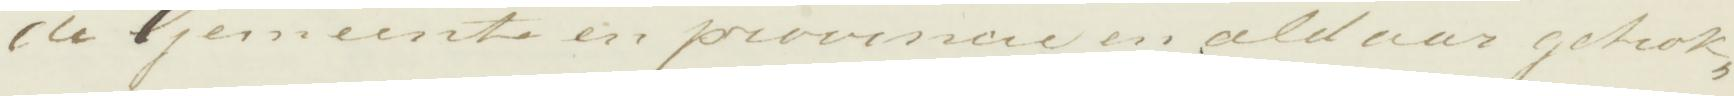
de Gemeente en provincie en aldaar getrok„
